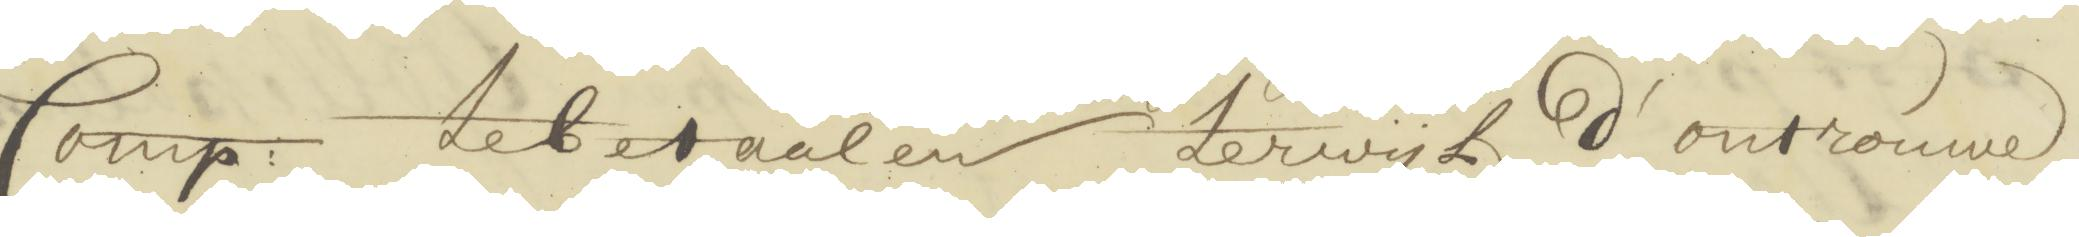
Comp: te betaalen terwijl d' ontrouwe
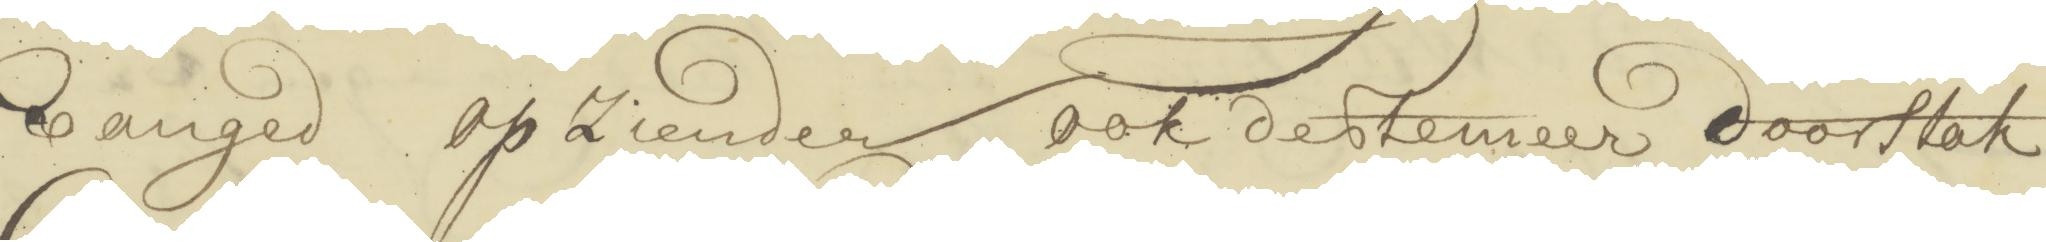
vanged op ziender ook des temeer doorstak
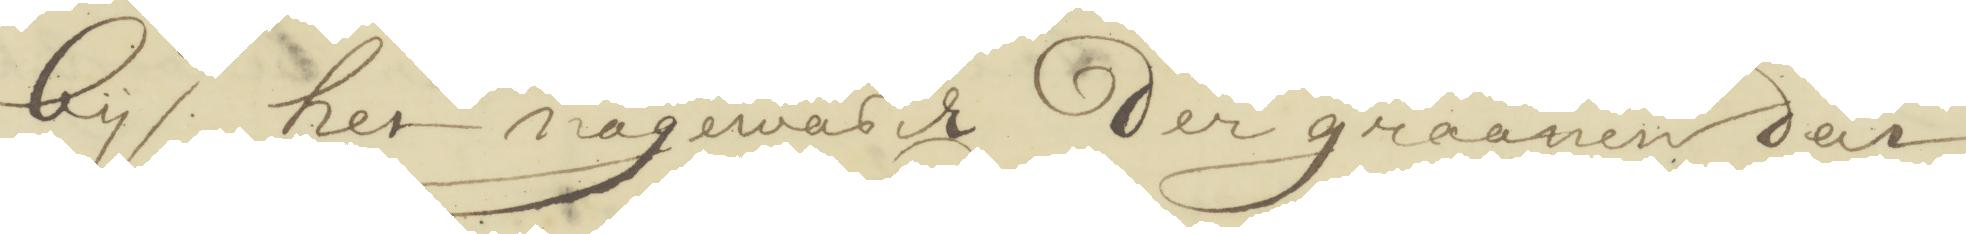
bij het nagewasch der graanen dat
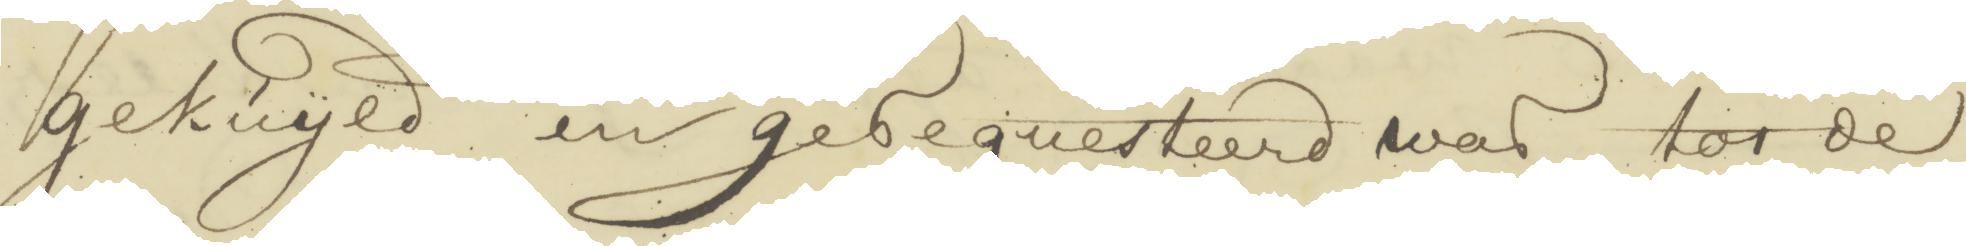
gekuijld en gesequesteerd was tot de
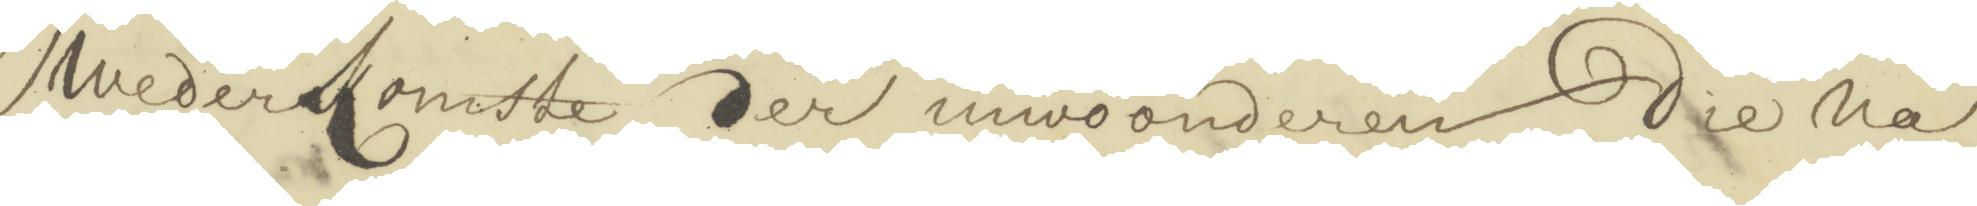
wederkomste der inwoonderen die na
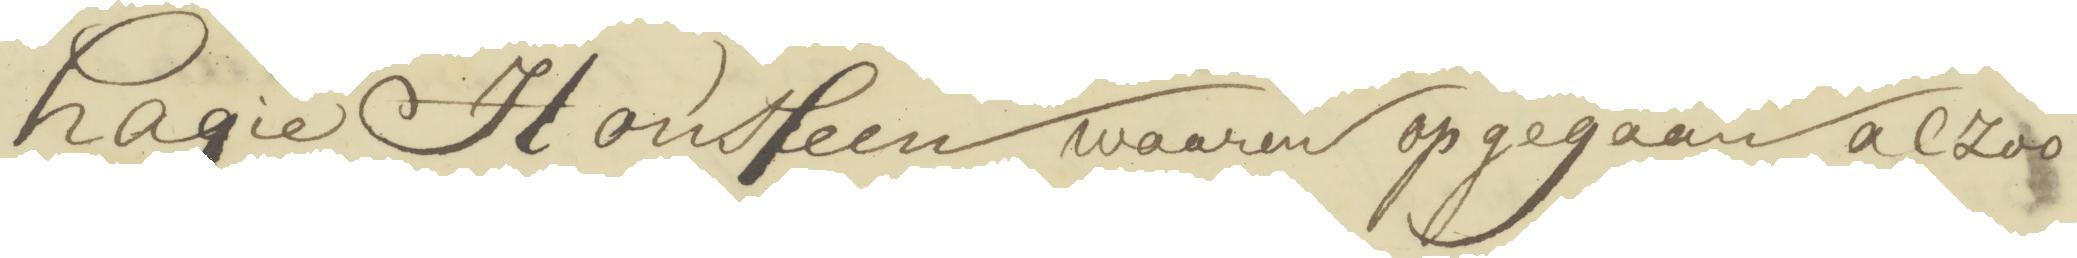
hagie Housseen waaren op gegaan alzoo
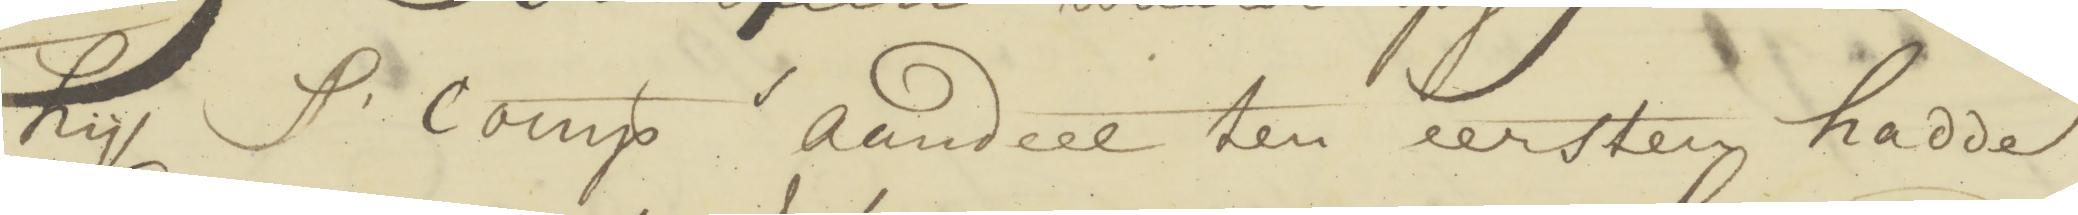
hij s' Comps aandeel ten eersten hadde
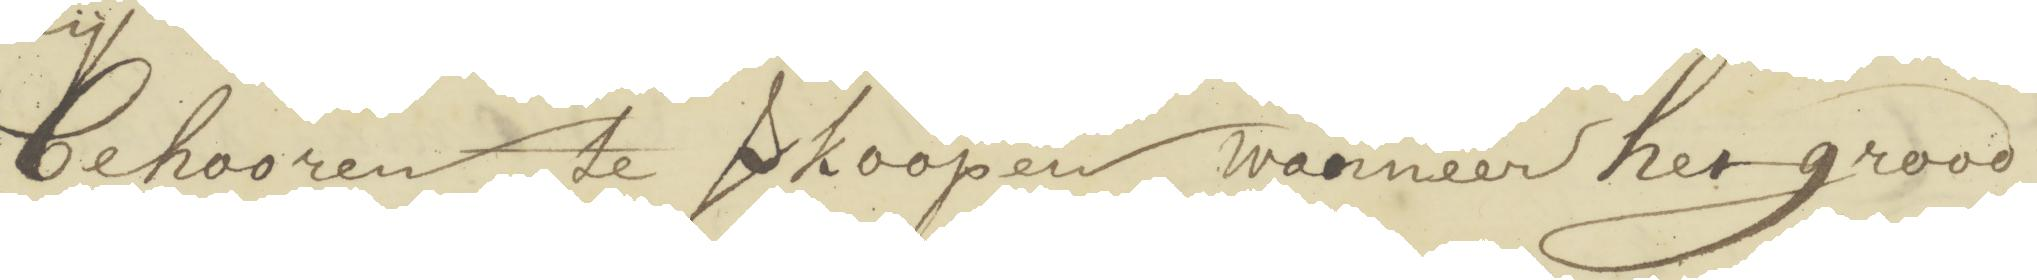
behooren te verkoopen wanneer het grood
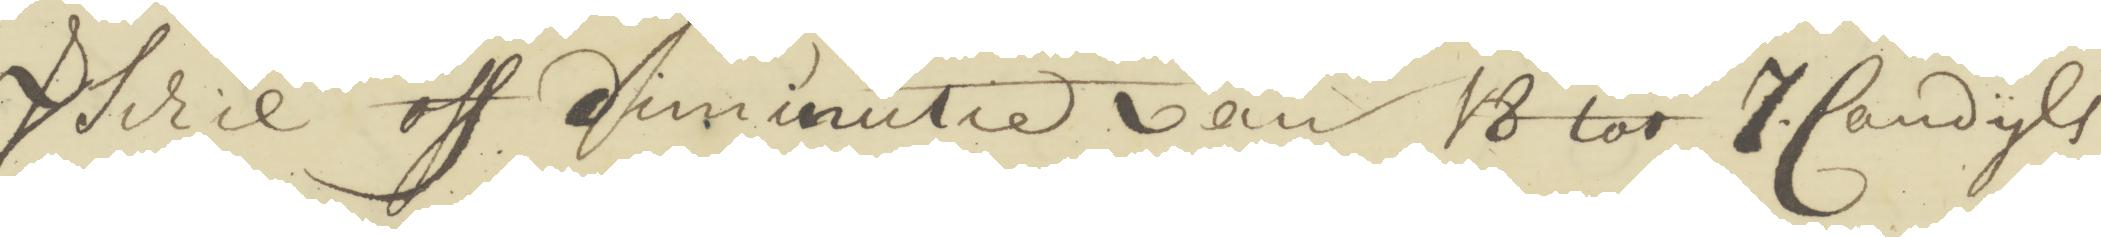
verschil off diminutie van 18 tot 7. Candijls
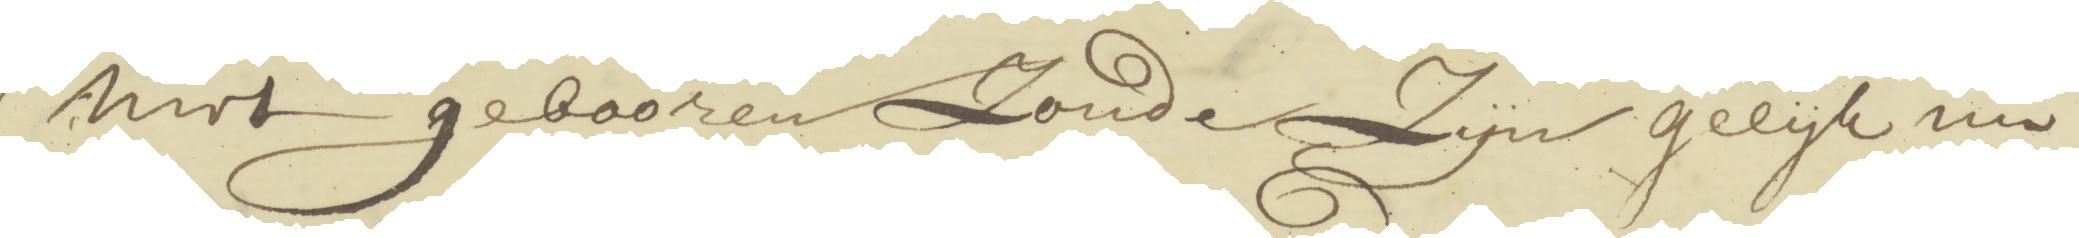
niet gebooren zoude zijn gelijk nu
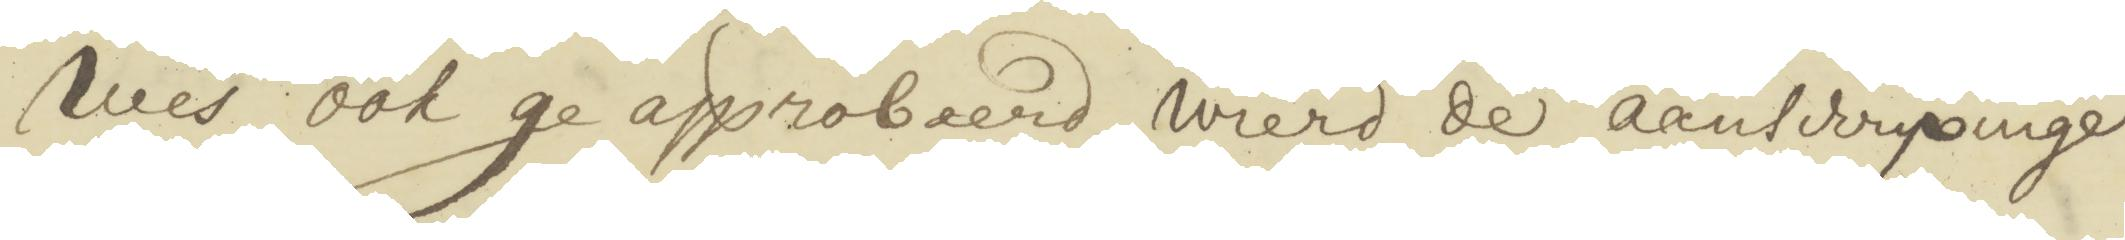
wes ook geapprobeerd wierd de aanschryvinge
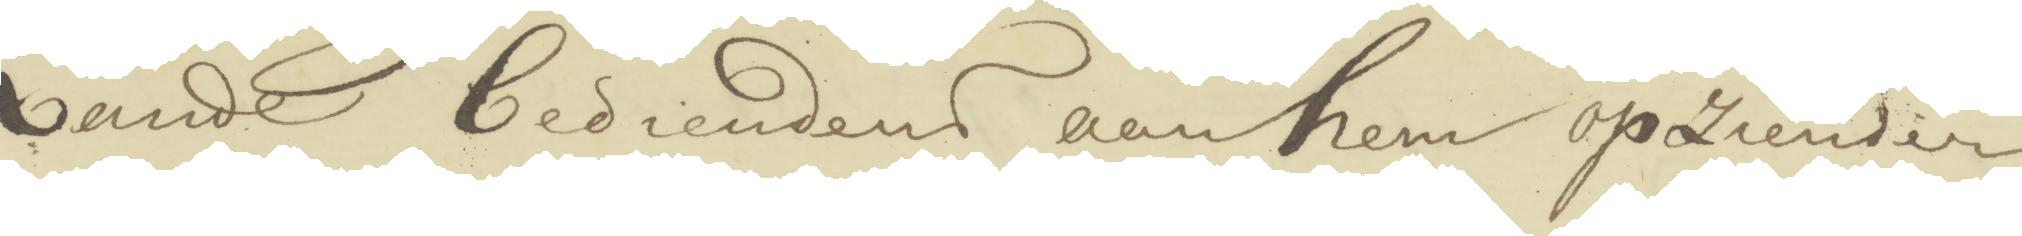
vande bediendens aan hem opziender
